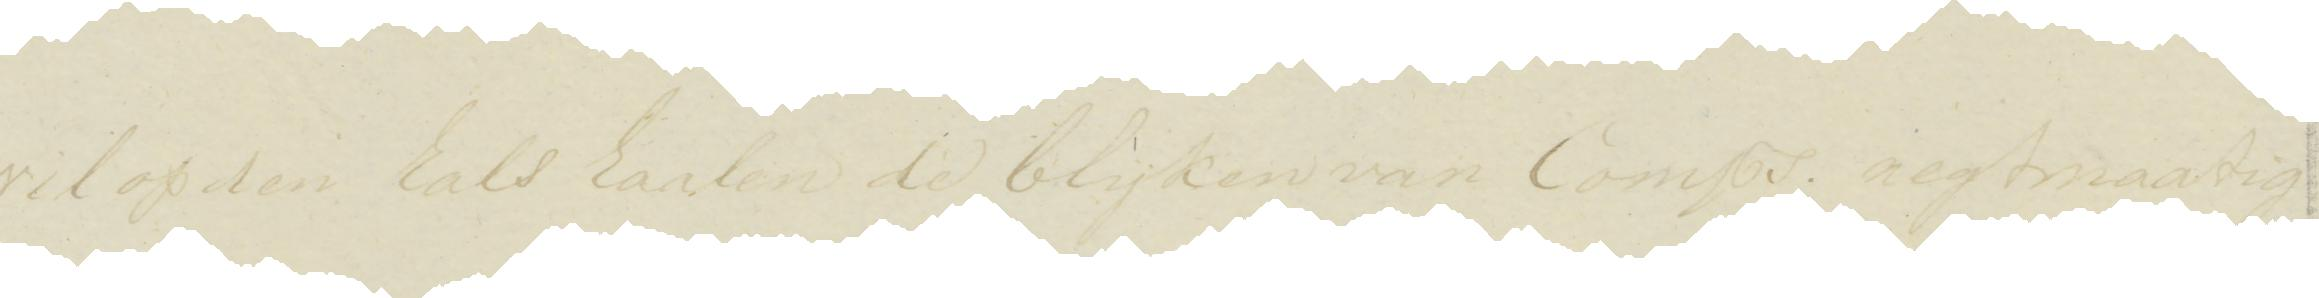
Wil op den hals haalen de blijken van Comps. regtmaatig
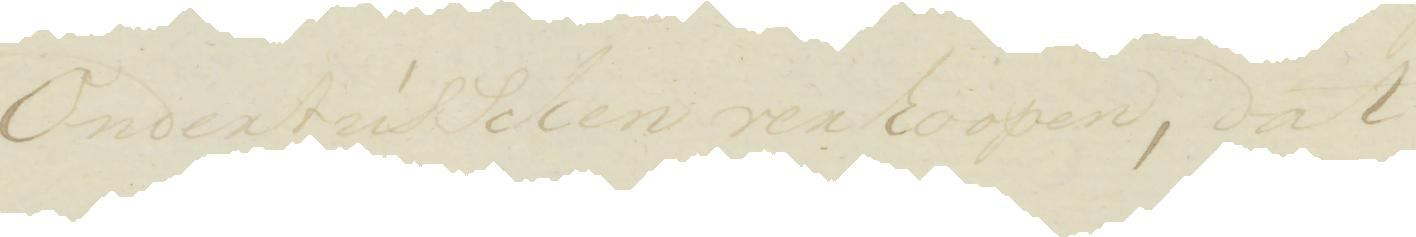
Ondertusschen verhoopen, dat
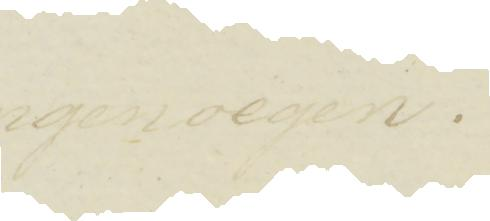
ongenoegen.
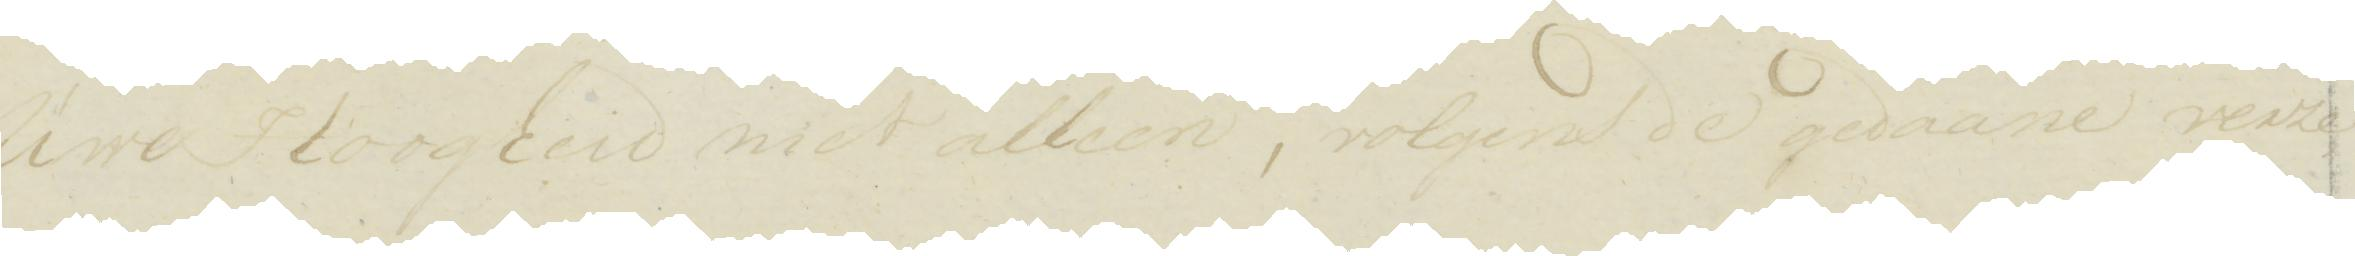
uwe Hoogheid niet alleen, volgens de gedaane verze„
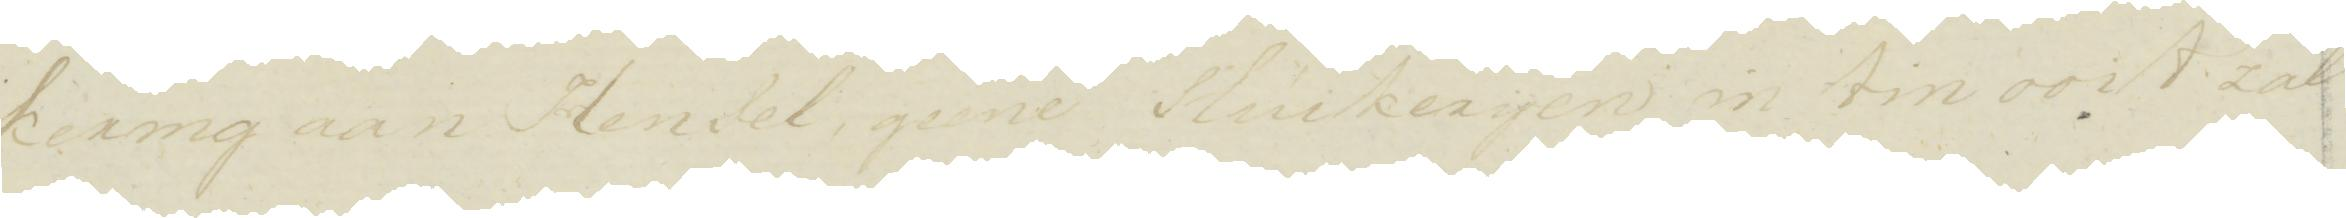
kering aan Hensel, geene sluikerijen in tin ooit zal
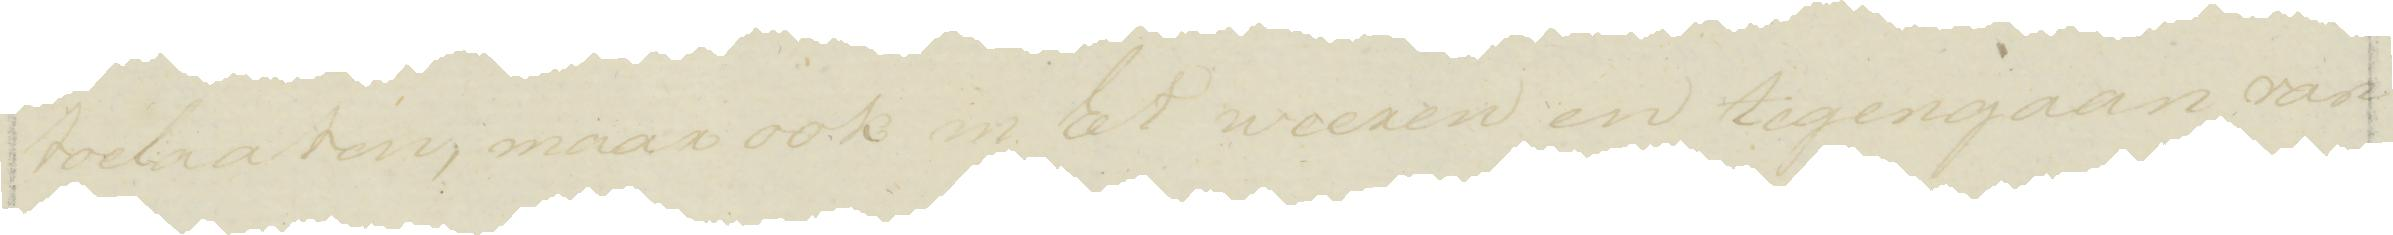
toelaaten maar ook in het weeren en tegengaan van
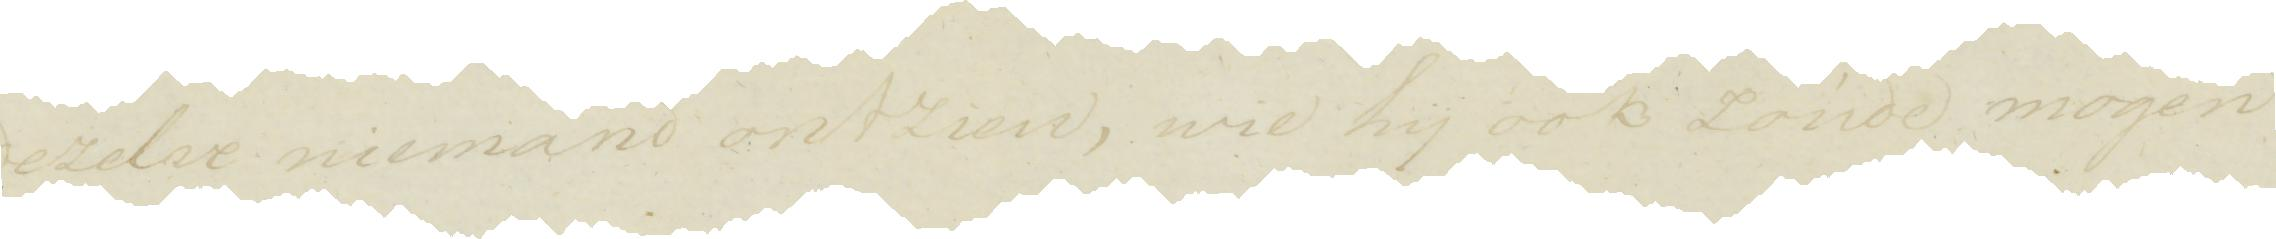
dezelve niemand ontzien, wie hij ook zoude mogen
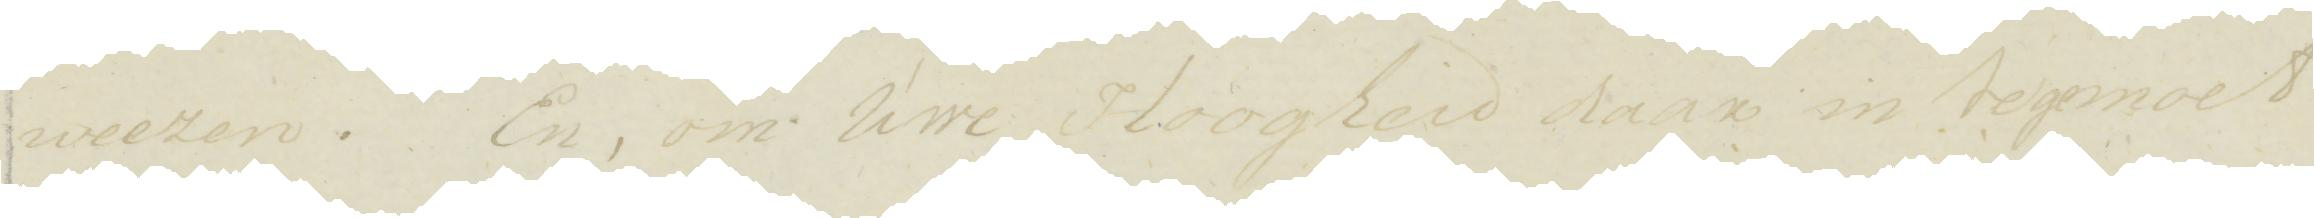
weezen. En, om uwe Hoogheid daar in tegemoet
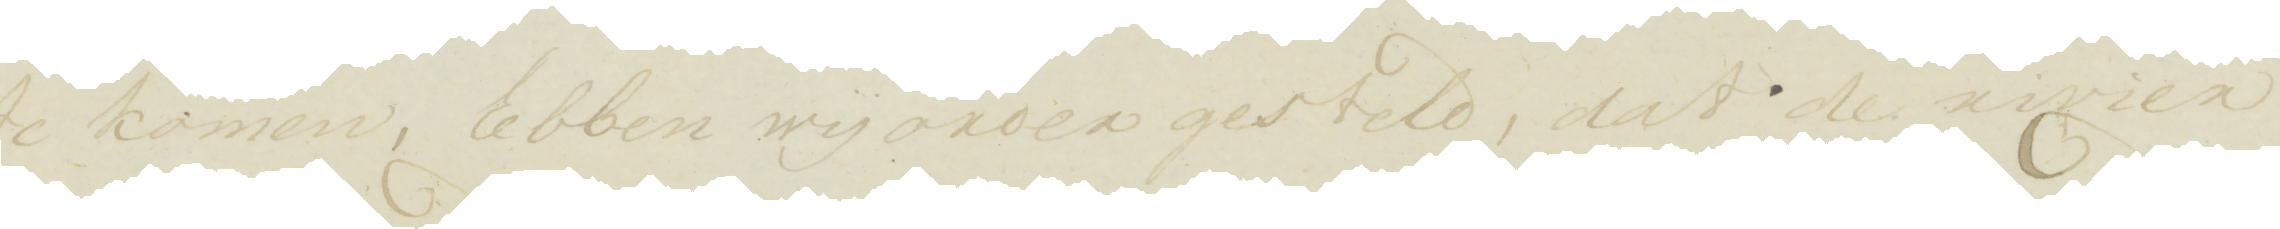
te komen, hebben wij order gesteld, dat de rivier
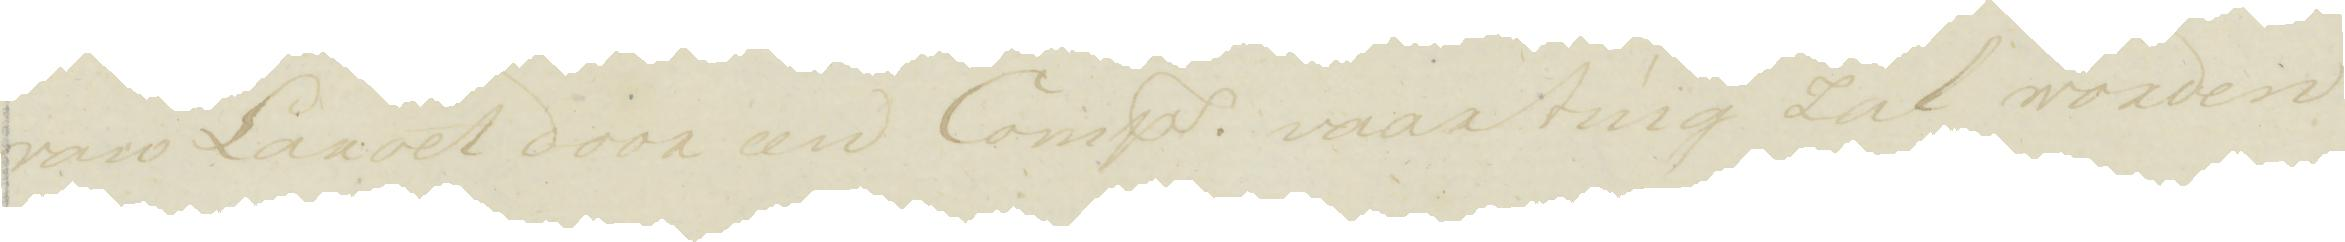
van Laroet door een Comps vaartuig zal worden
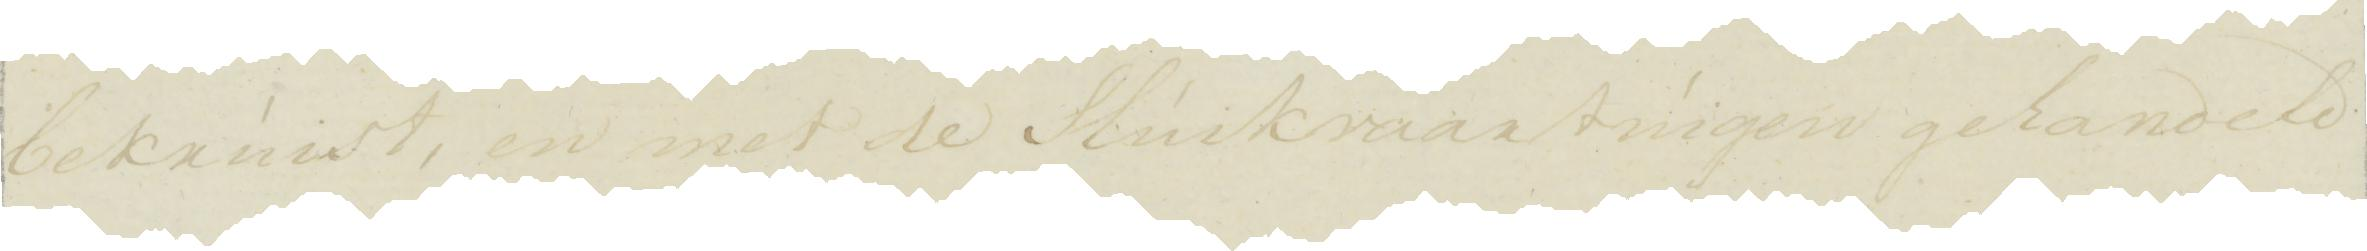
bekruist, en met de Sluikvaartuigen gehandeld
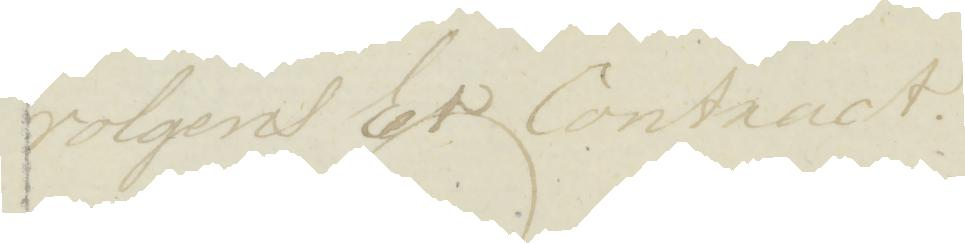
volgens het contract.
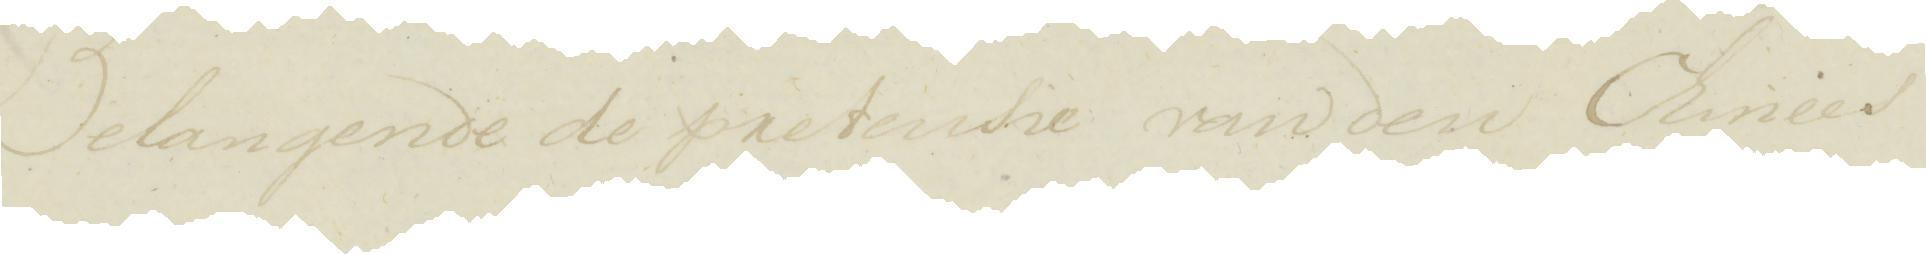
Belangende de pretensie van den Chinees
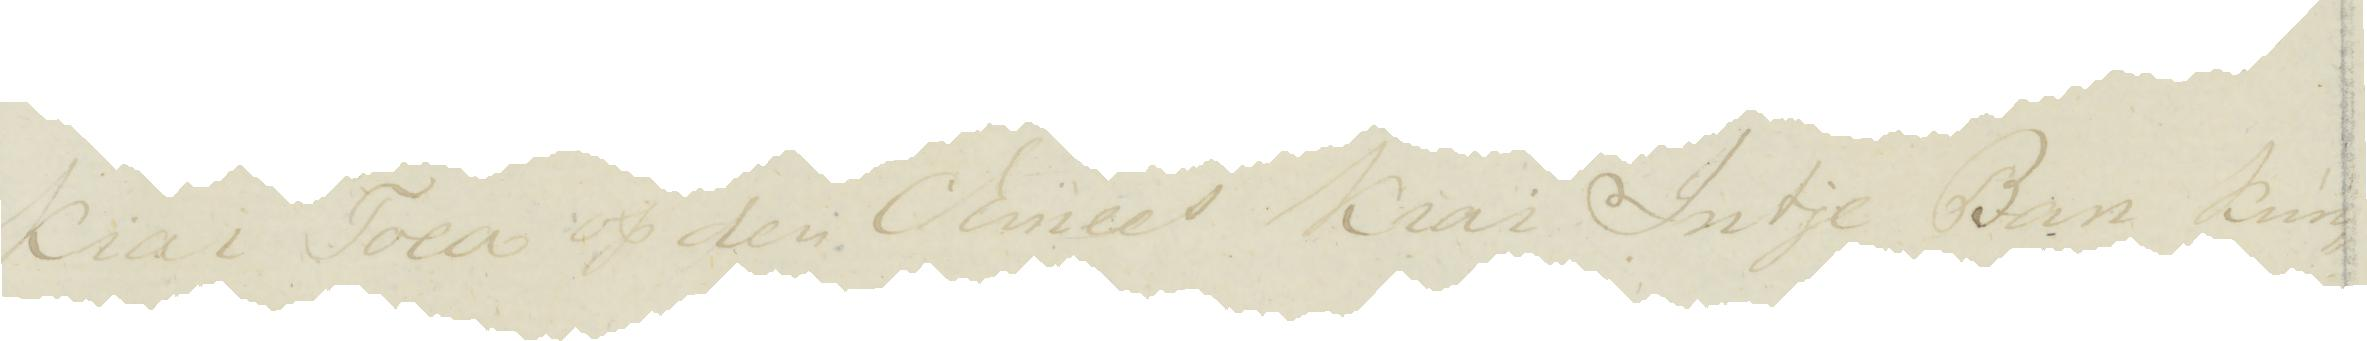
Kiai Toea op den Chinees Kiai Intje Ban kun
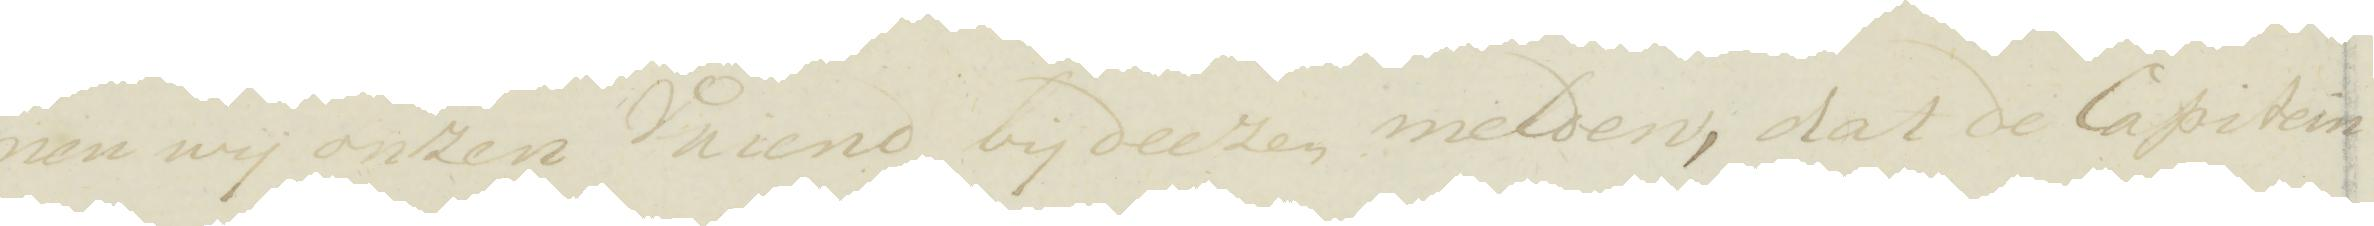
nen wij onzen Vriend bij deezen melden, dat de Capitein
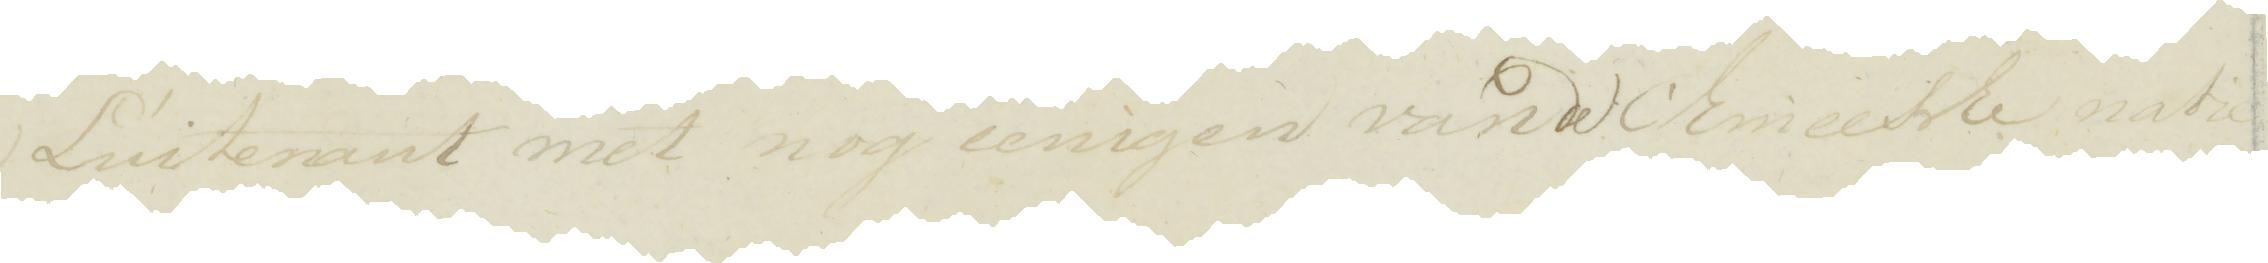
en Luitenant met nog eenigen van de Chineesche natie
